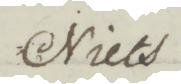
Niets
